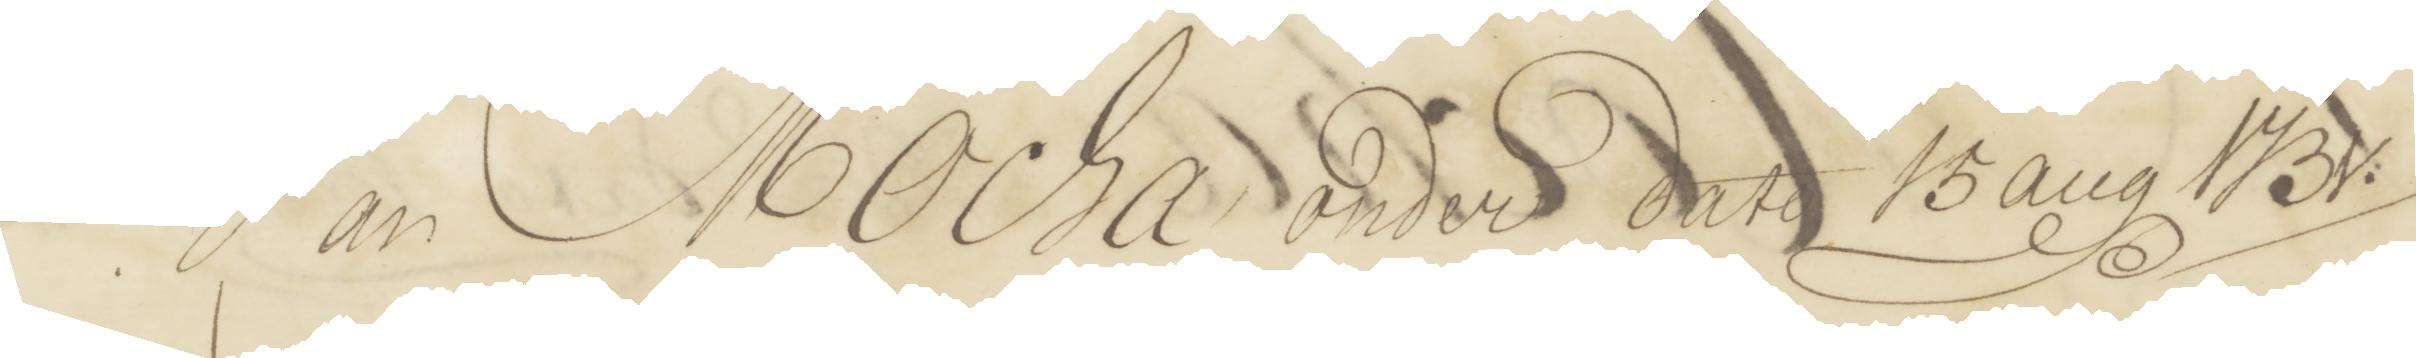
Van Mocha onder dato 15 aug 1731:
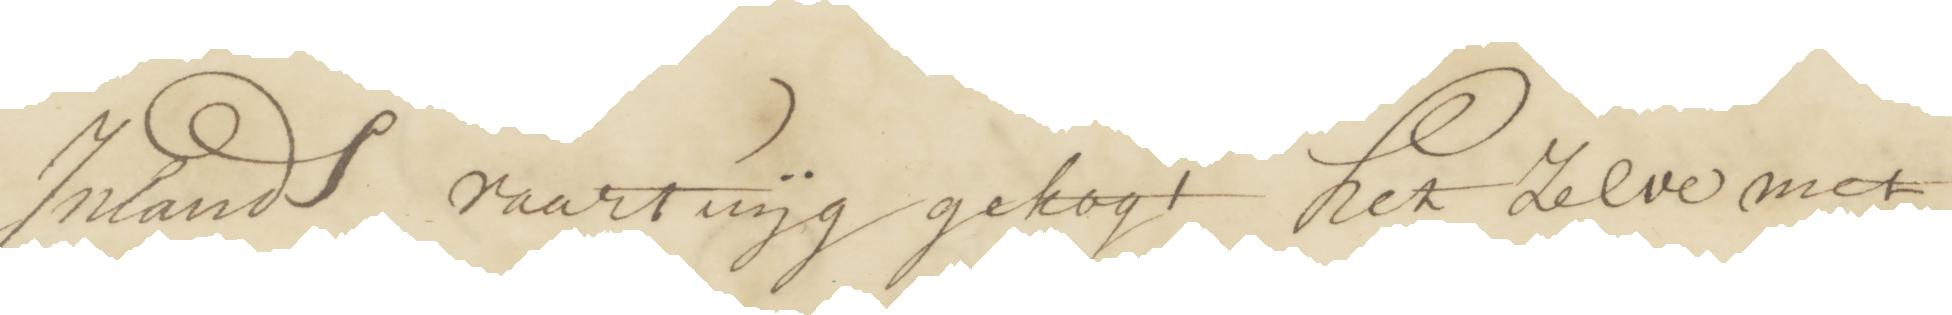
Jnlands vaartuijg gekogt her zelve met
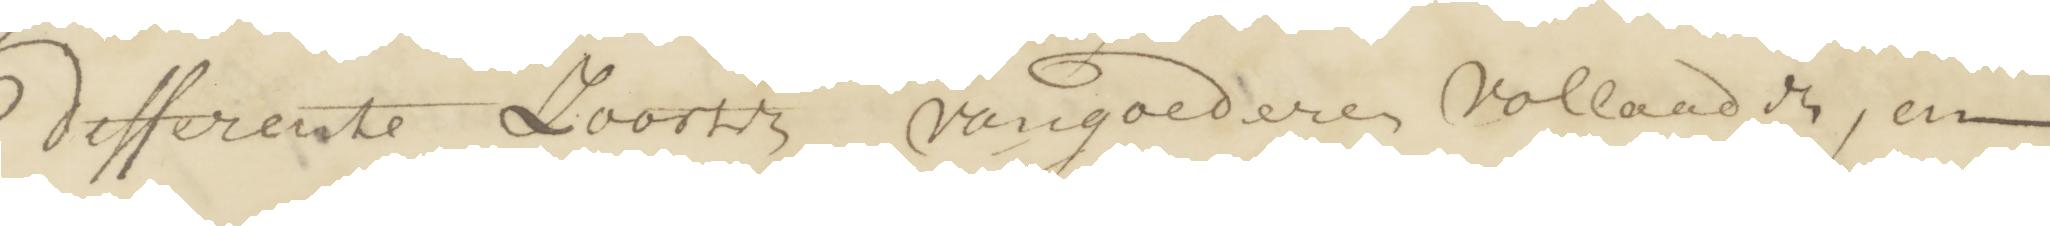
differente zoorten vangoederen vollaaden, en
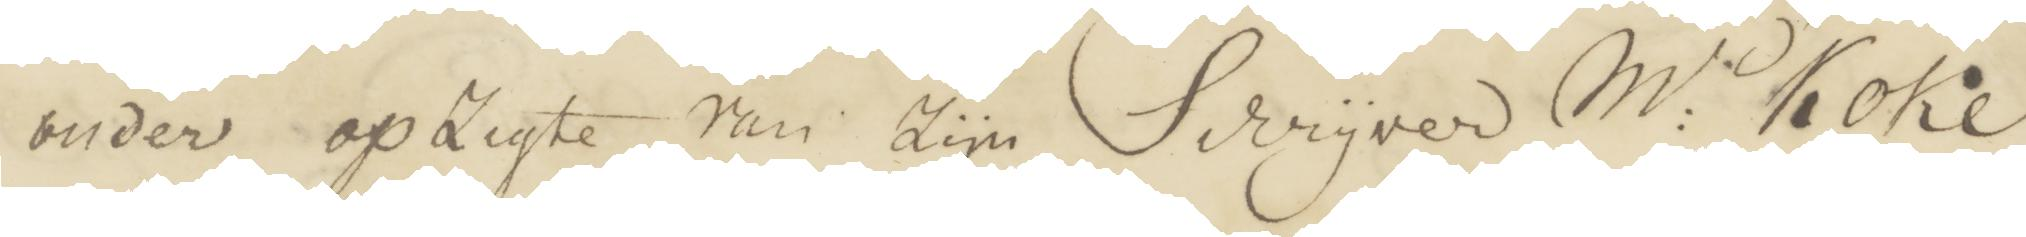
onder opzigte van zijn schrijver M:r Koke
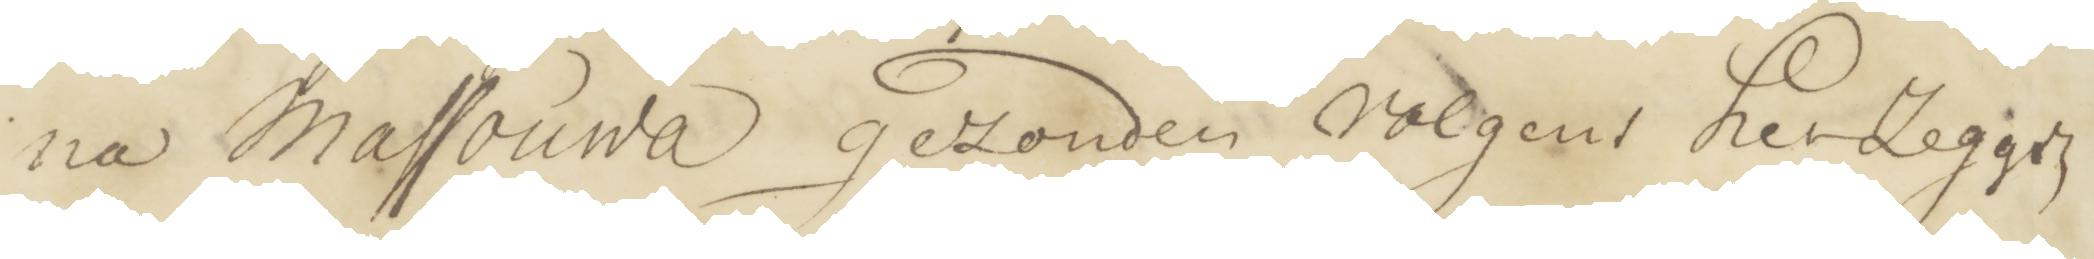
na Massouwa gezonden volgens het zeggen
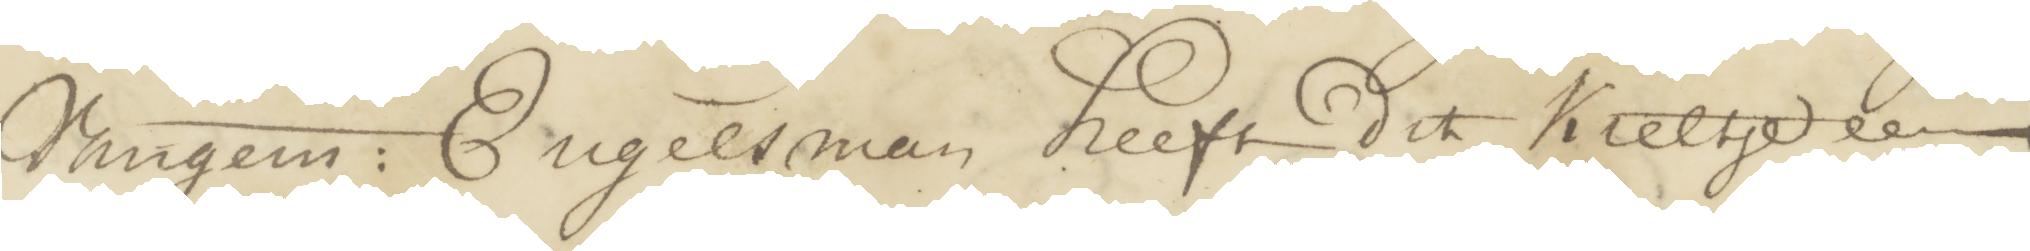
vangem: Engelsman heeft dit kieltje een
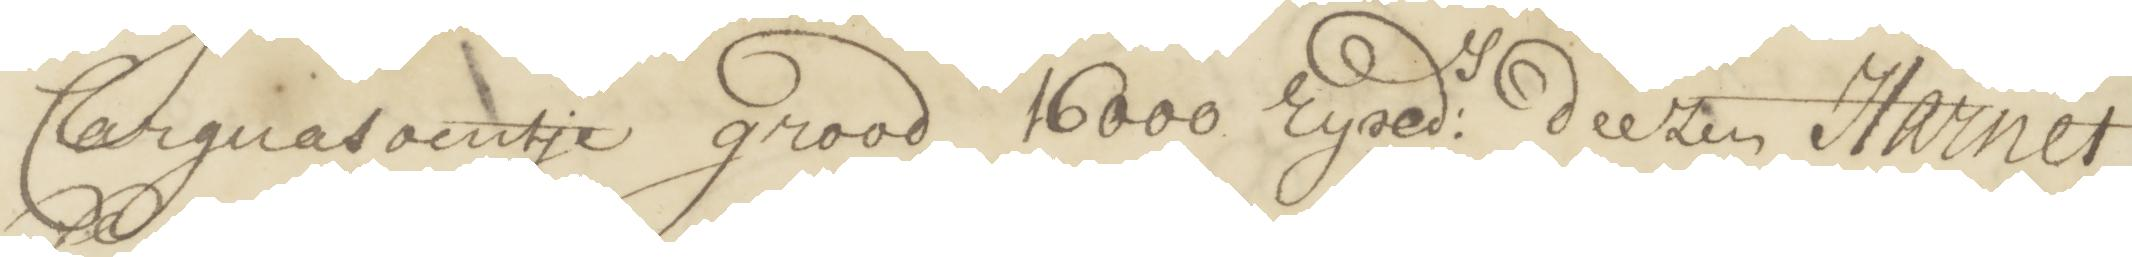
Carguasoentje grood 16000 ryxd:s deezen Harnet
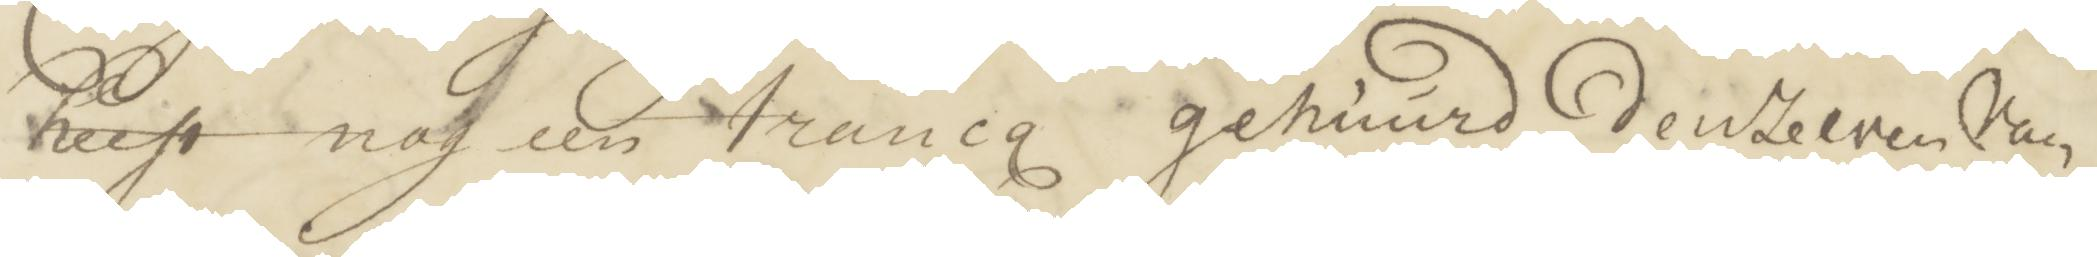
heeft nog een trancq gehuurd denzelven van
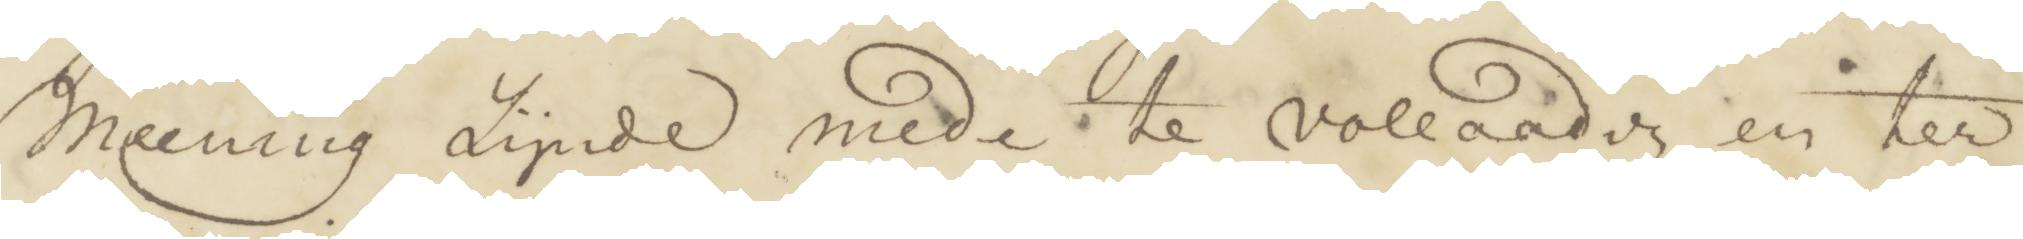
meening zijnde mede te vollaaden en ter
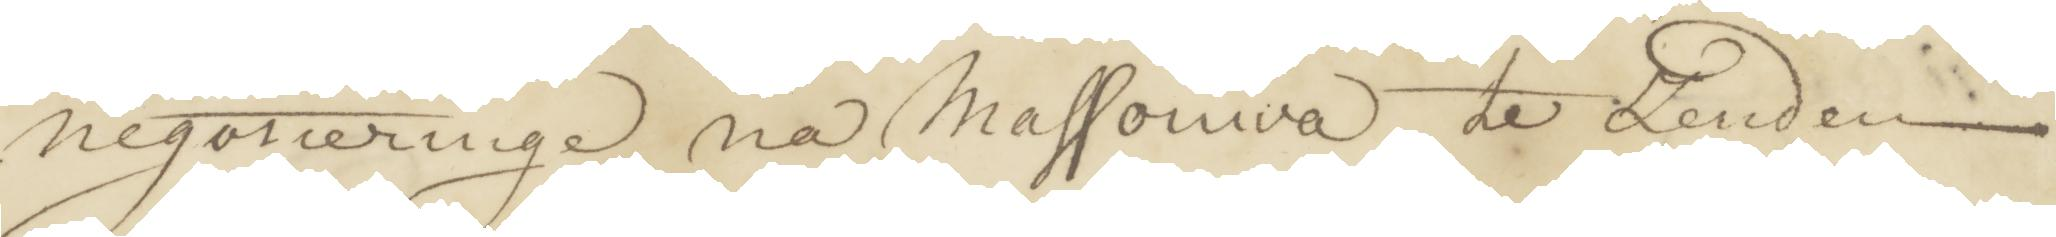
negotieringe na Massouwa te zenden
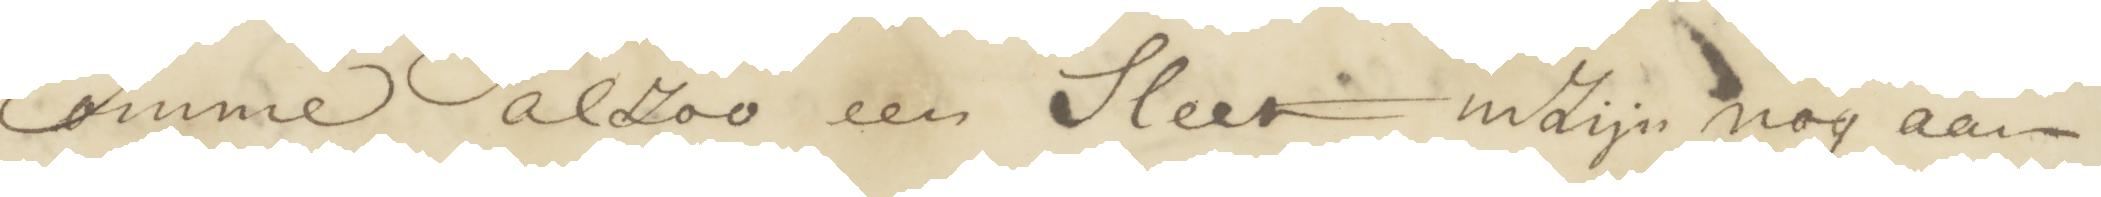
omme alzoo een sleet in zijn nog aan
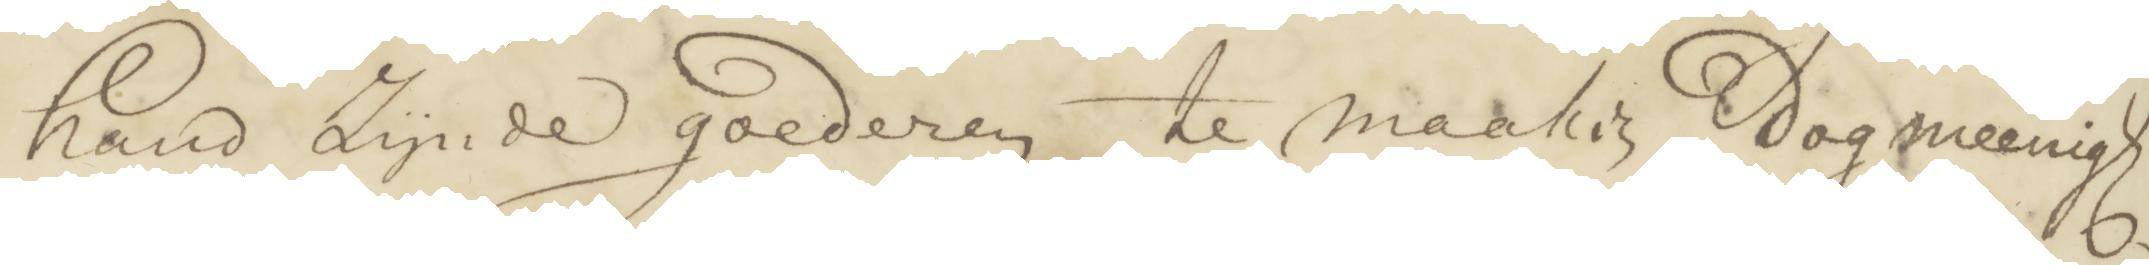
hand zijnde goederen te maaken, dog meenigh
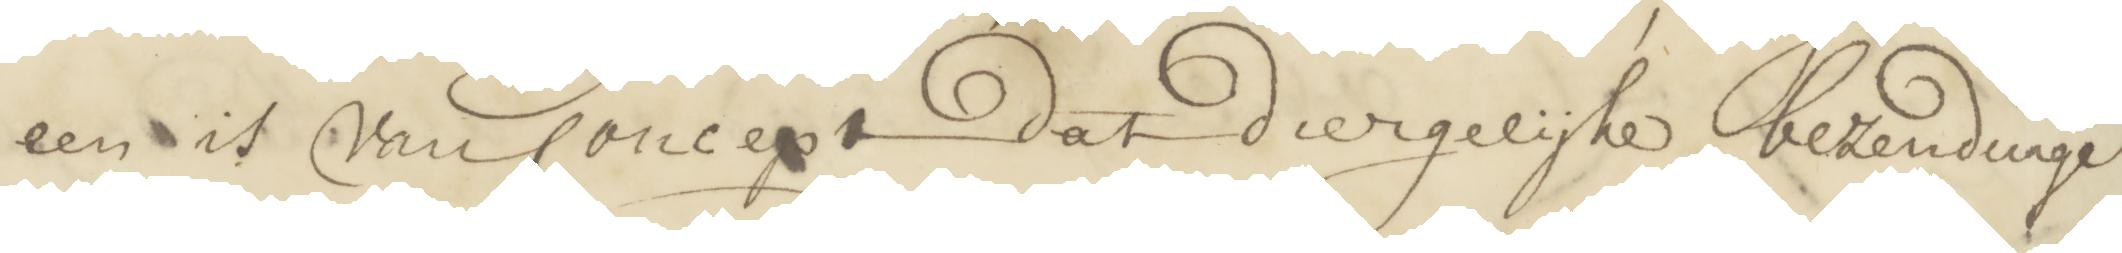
een is van Concept dat diergelijke bezendinge
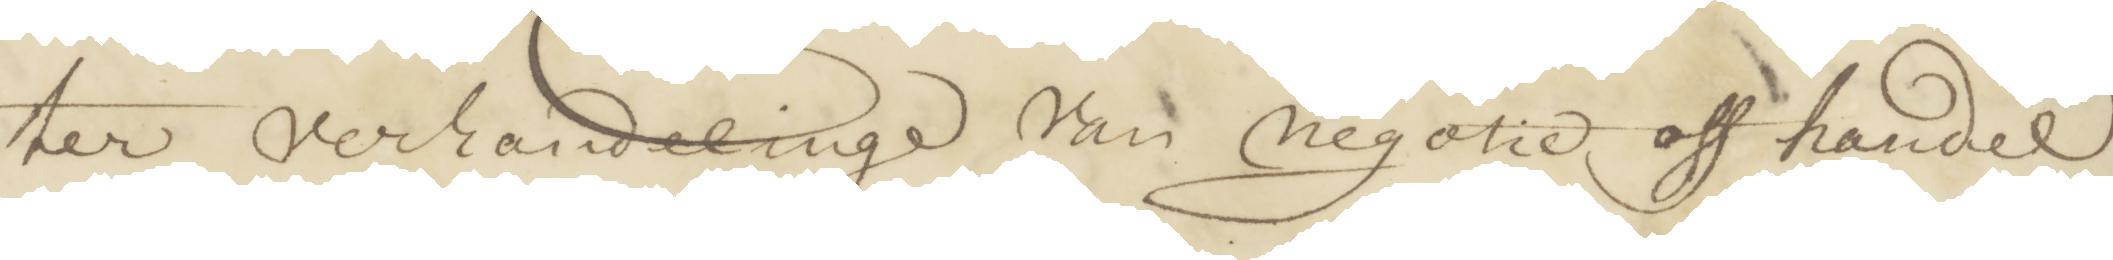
ter verhandelinge van negotie off handel
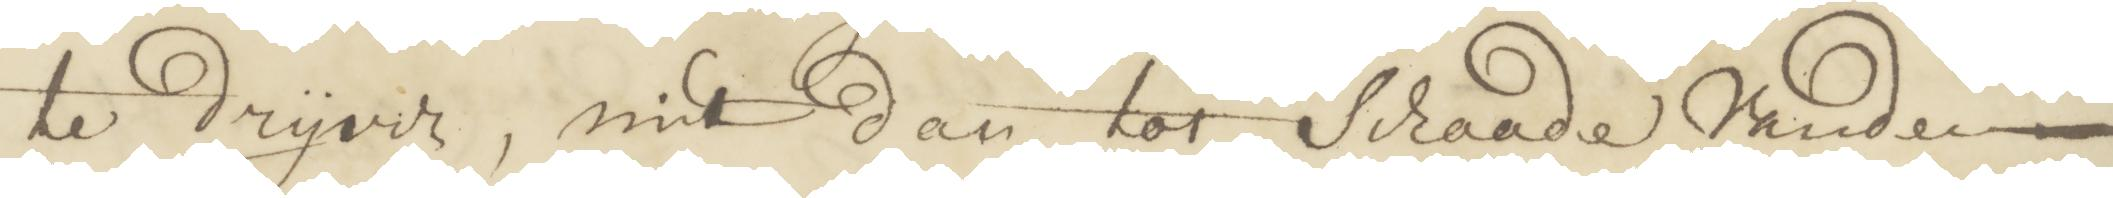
te drijven, niet dan tot schaade vanden
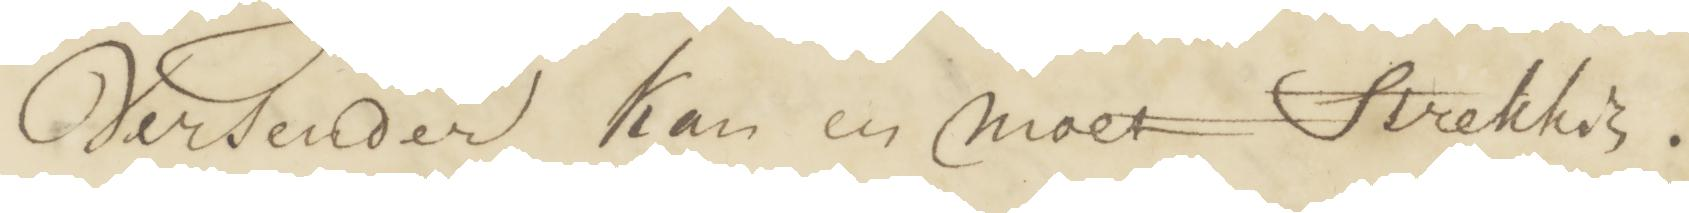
versender kan en moet strekken.
